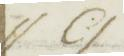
„ 9
